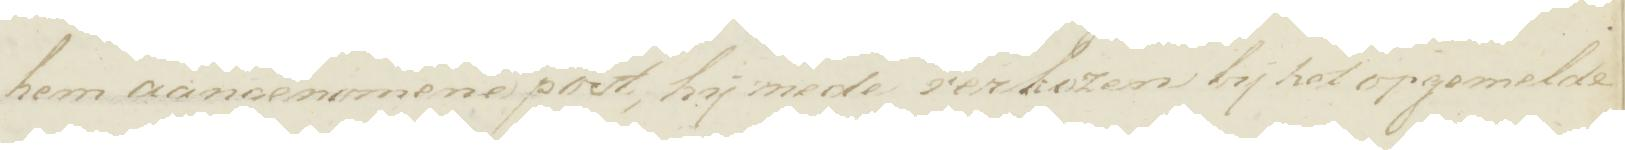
hem aangenomene post, hij mede verkozen bij het op gemelde
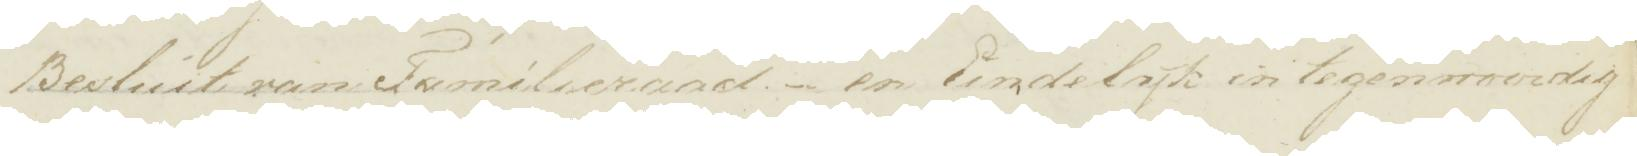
Besluit van Familieraad. — en Eindelijk in tegenwoordig
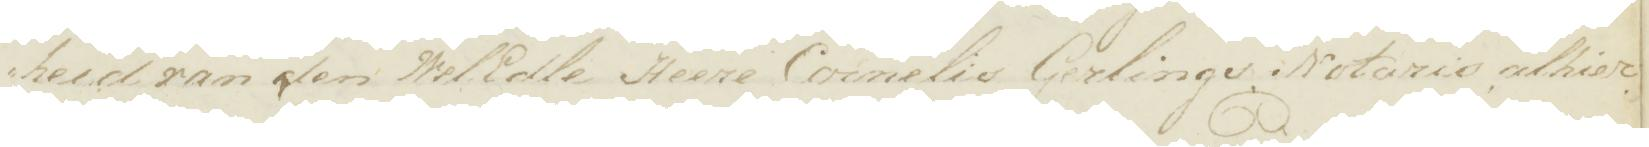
„heid van den Wel Edle Heere Cornelis Gerlinge Notaris alhier
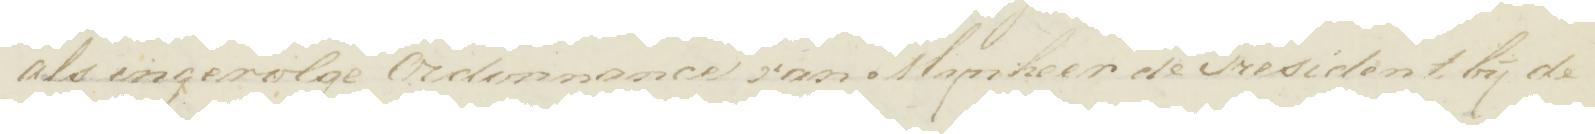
als ingevolge Ordinnance van Myn heer de President bij de
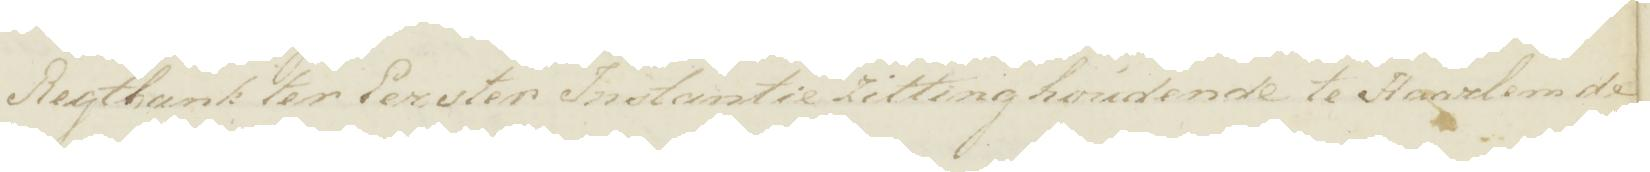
Regtbank ter Eerster Jnstantie zitting houdende te Haarlem de
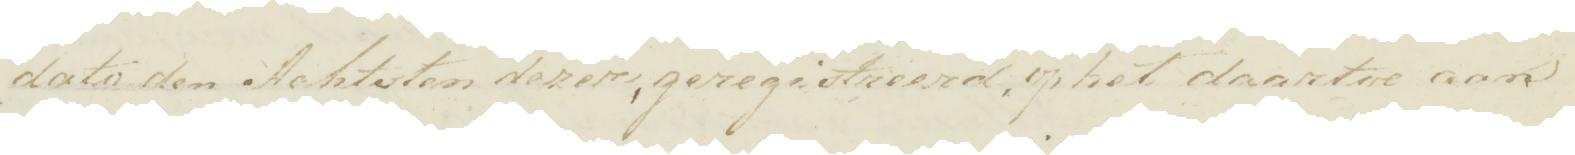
dato den Achtsten dezer, geregistreerd op het daartoe aan
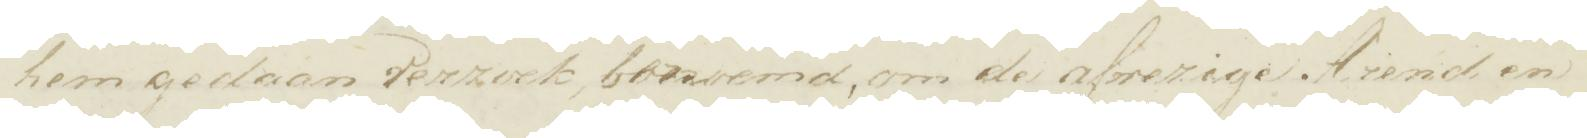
hem gedaan verzoek, benoemd, om de afwezige Arend en
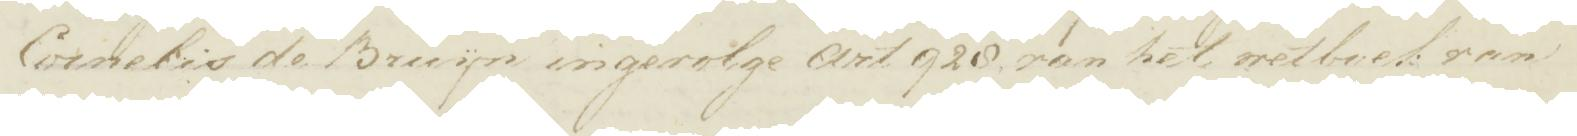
Cornelis de Bruijn ingevolge Art 928. van het wetboek van
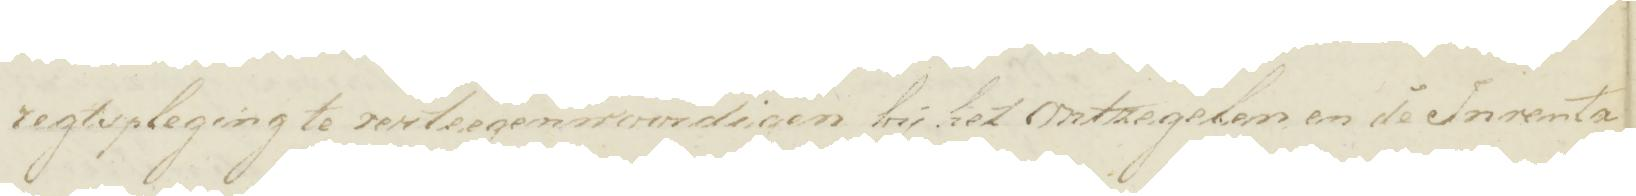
regtspleging te verteegenwoordigen bij het ontzegelen en de Jnventa
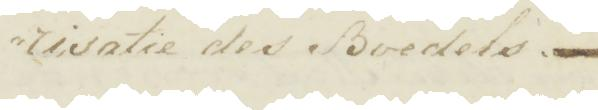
risatie des Boedels.
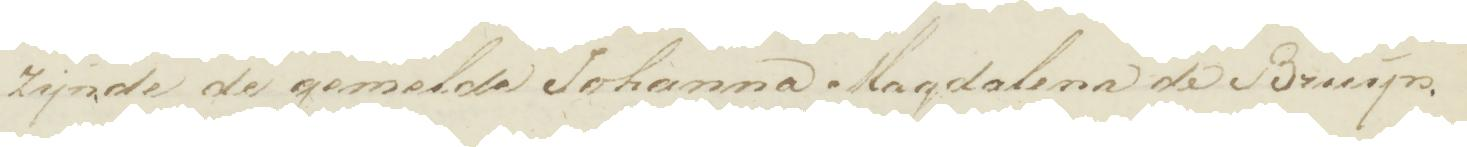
zijnde de gemelde Johanna Magdalena de Bruijn
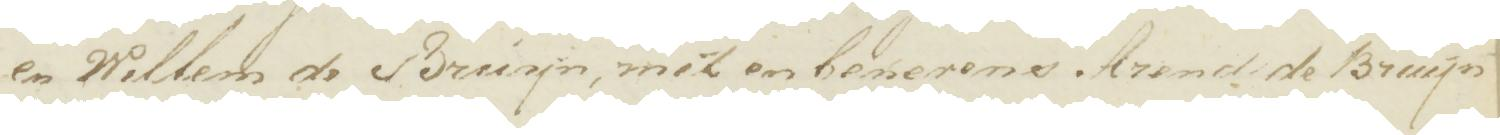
en Willem de Bruijn, met en benevens Arend de Bruijn
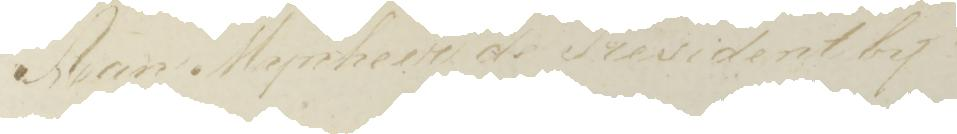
Aan Myn heer de President bij
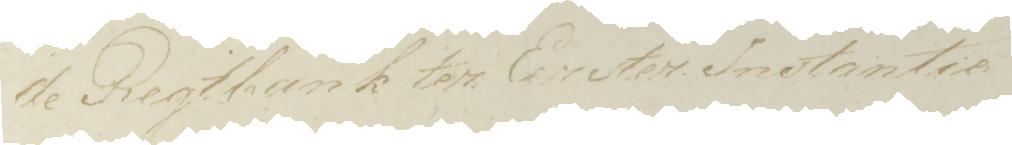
de Regtbank ter Eerster Jnstantie
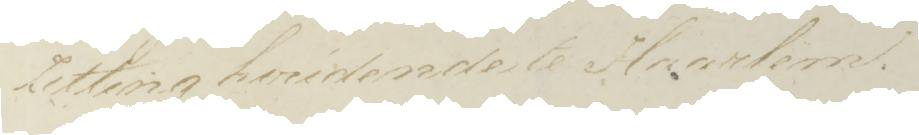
zitting houdende te Haarlem.
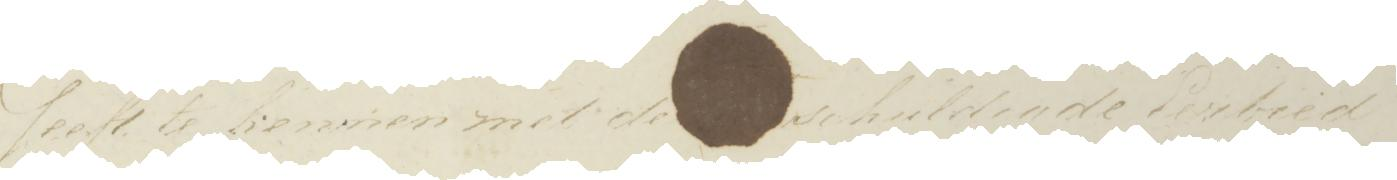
Geeft te kennen met de in schuldigde Eerbied
